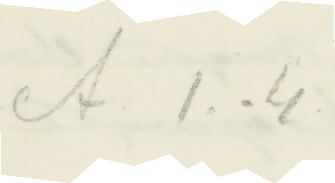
A 1. -4
